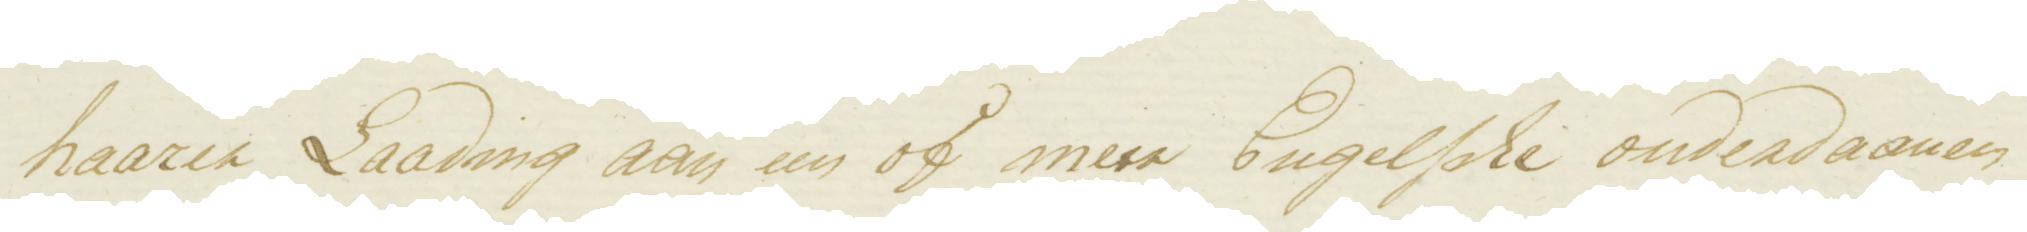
haarer Laading aan een of meer Engelsche onderdaanen
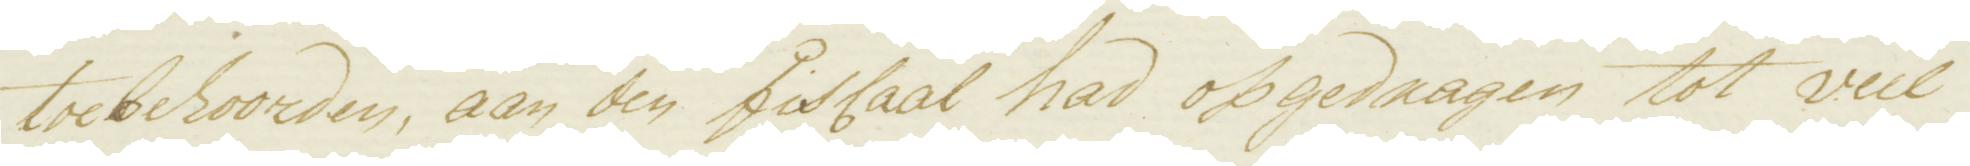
toebehoorden, aan den fiscaal had opgedragen tot veel
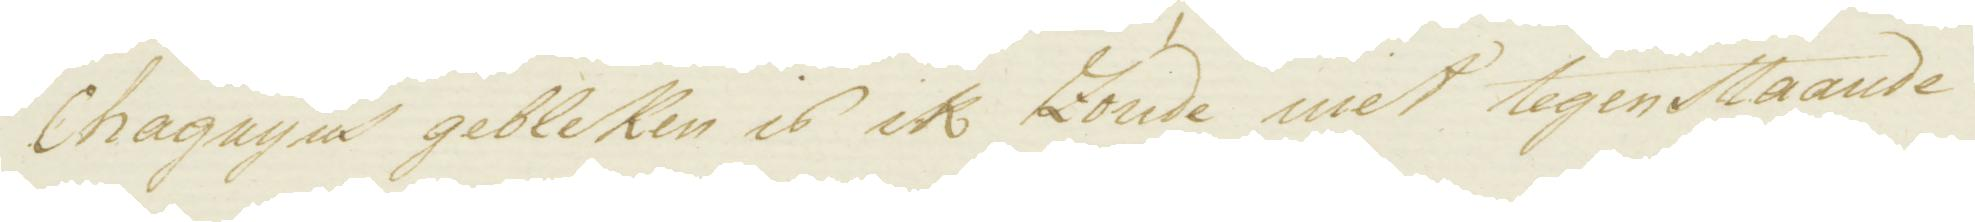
Chagrijns gebleken is ik zoude niet tegenstaande
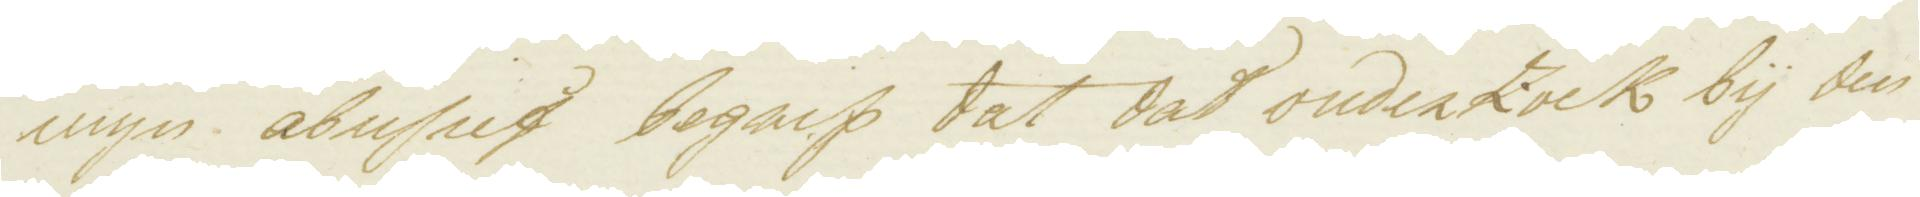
mijn abusief begrip dat dat onderzoek bij den
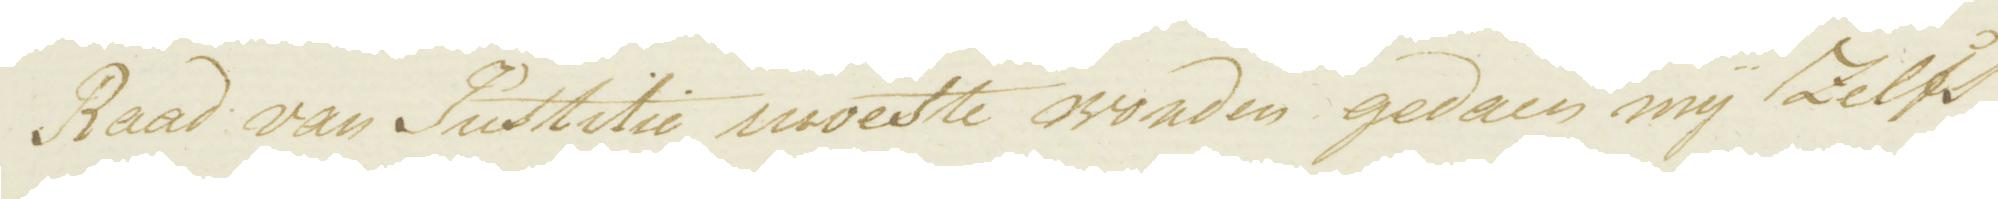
Raad van Iustitie moeste worden gedaen mij zelfs
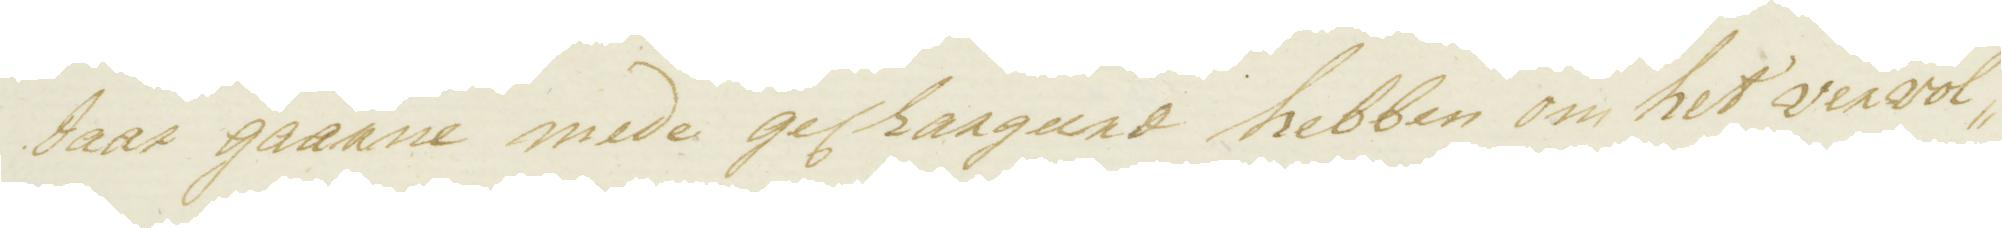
daar gaarne mede gechargeerd hebben om het vervol„
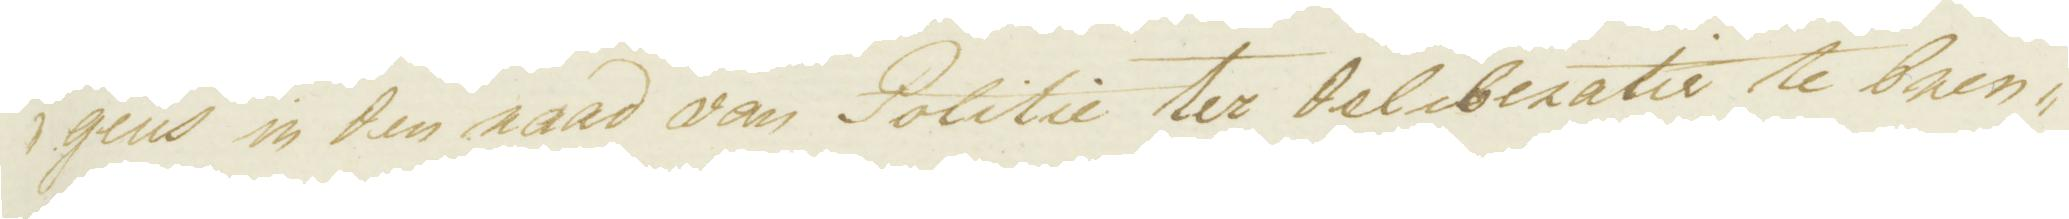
gens in den raad van Politie ter deliberatie te bren„
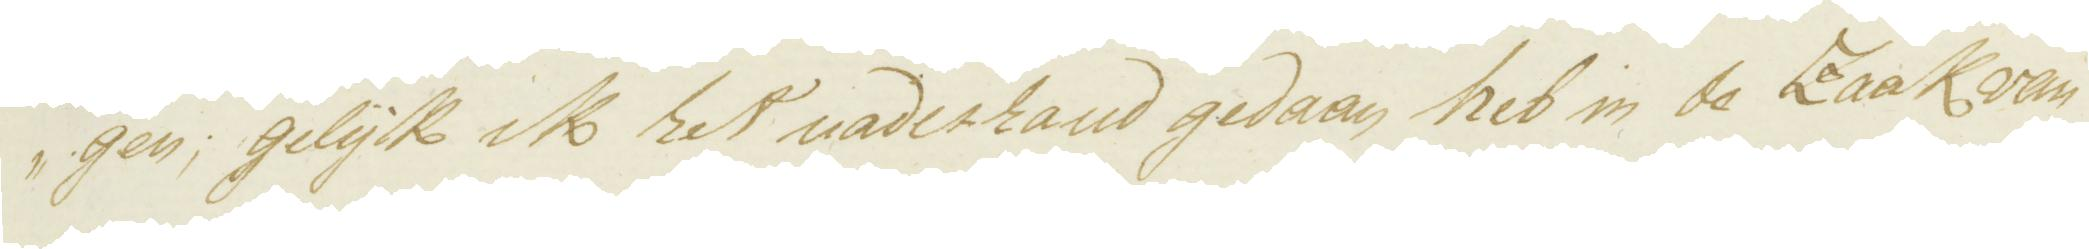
„gen; gelijk ik het naderhand gedaan heb in de Zaak van
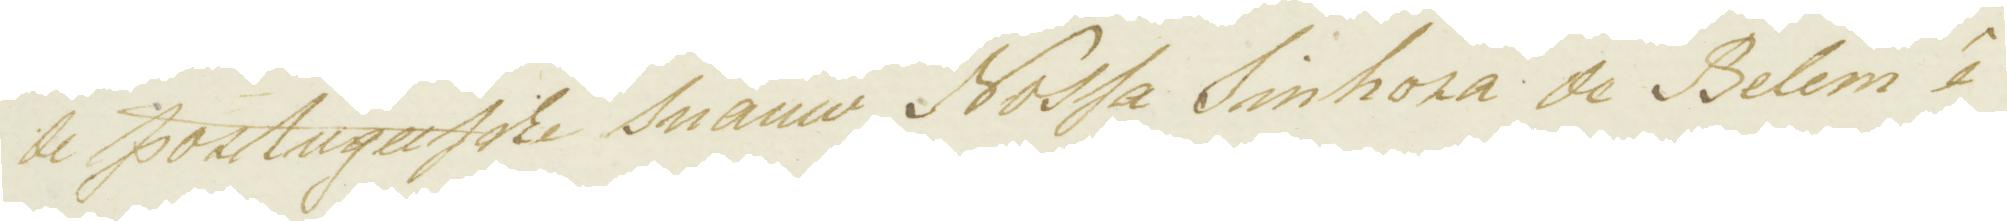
de portugeesche snauw Nossa Sinhora de Belem 't
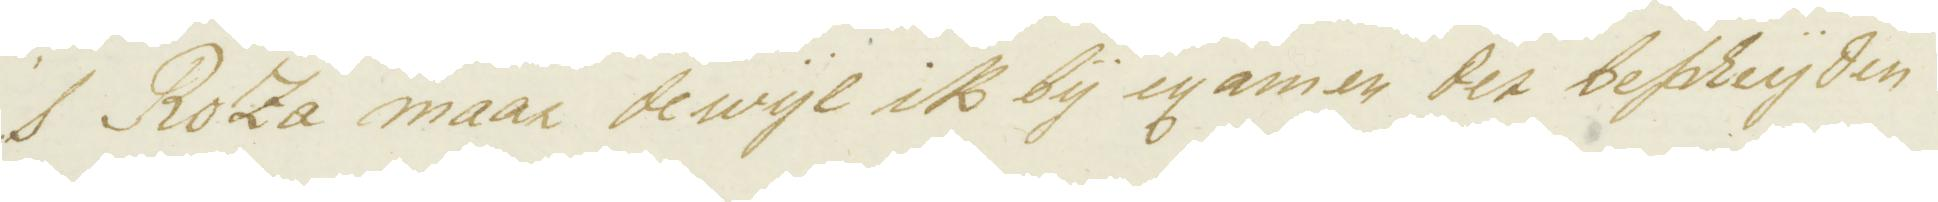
's Roza maar dewijl ik bij examen der bescheijden
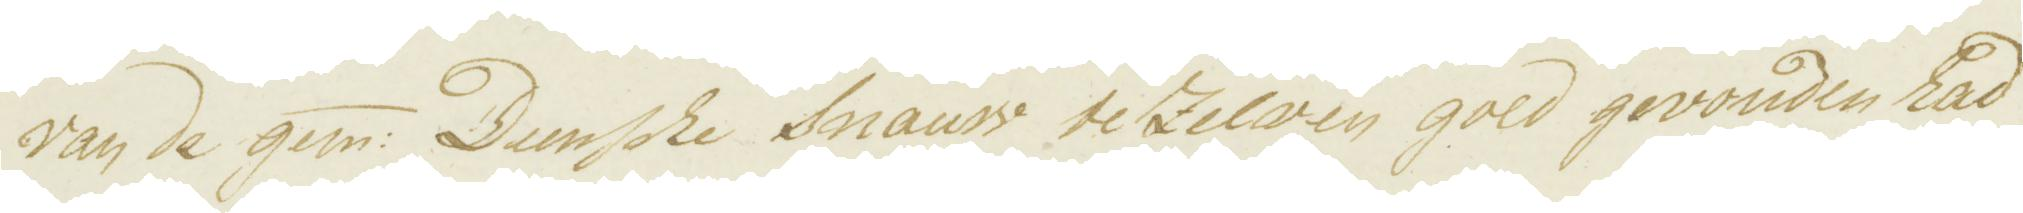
van de gem: Deensche snauw tezelven goed gevonden had
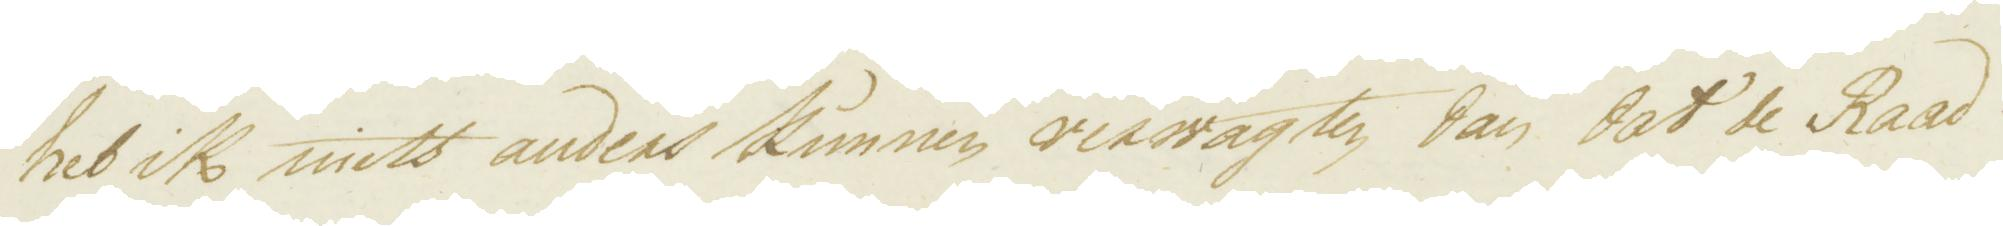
heb ik niets anders kunnen verwagten dan dat de Raad
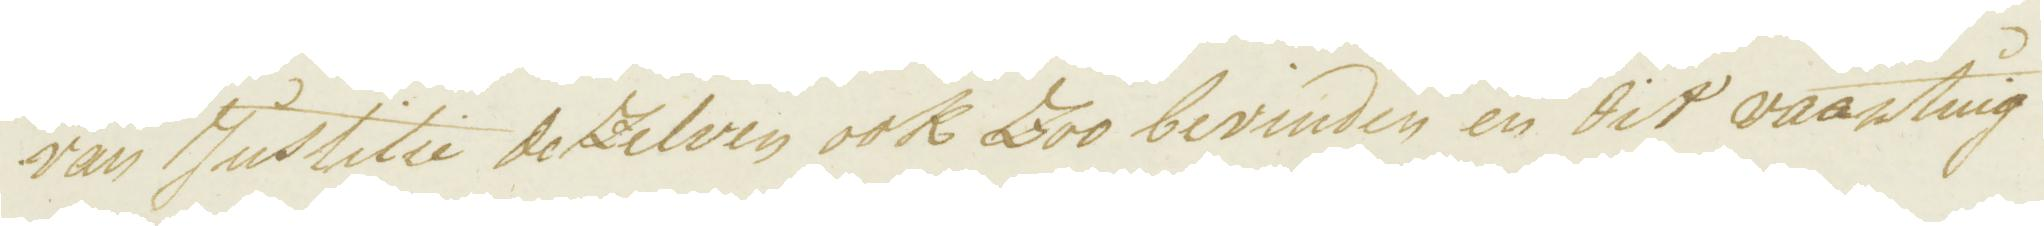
van Justitie dezelven ook zoo bevinden en dit vaartuig
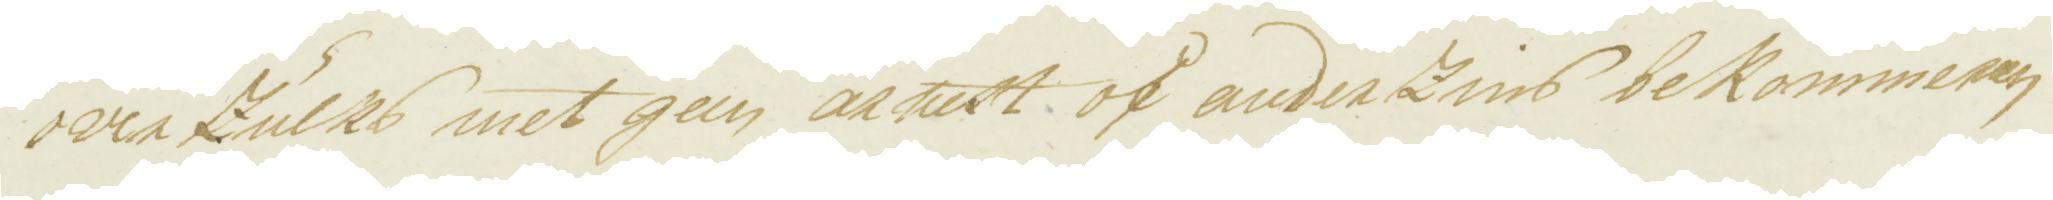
overzulks met geen arrest of anderzins bekommeren
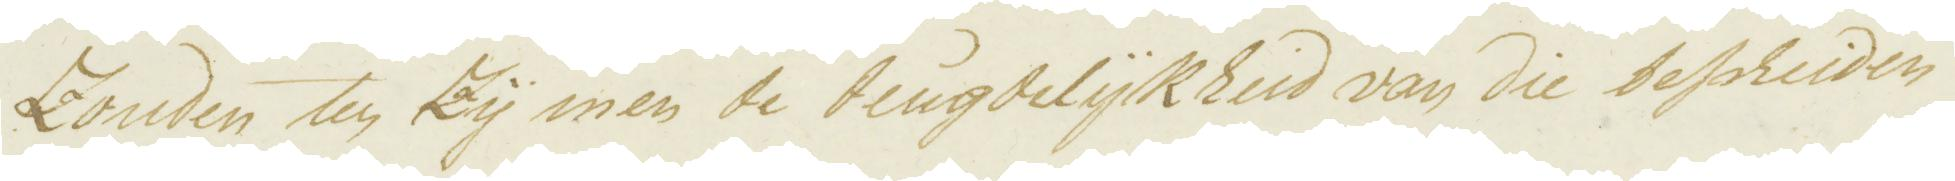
zouden ten zij men de deugdelijkheid van die bescheiden
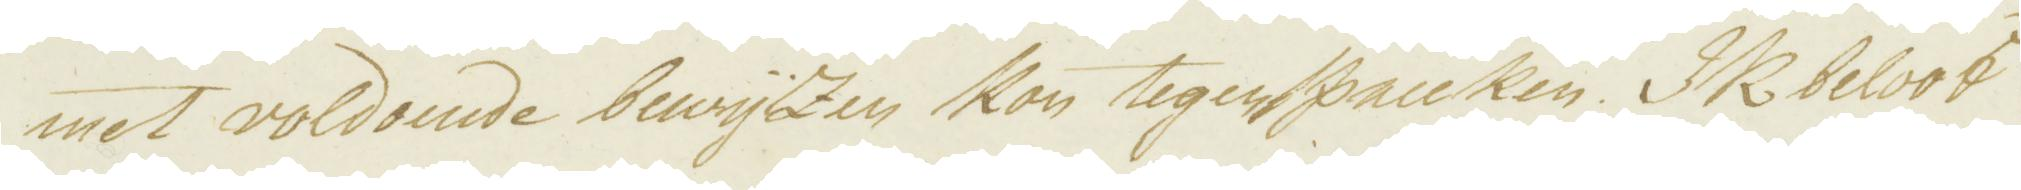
met voldoende bewijzen kon tegenspreeken. Ik beloof
